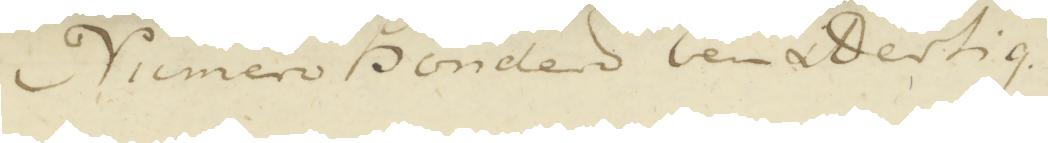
Numero Honderd & Dertig
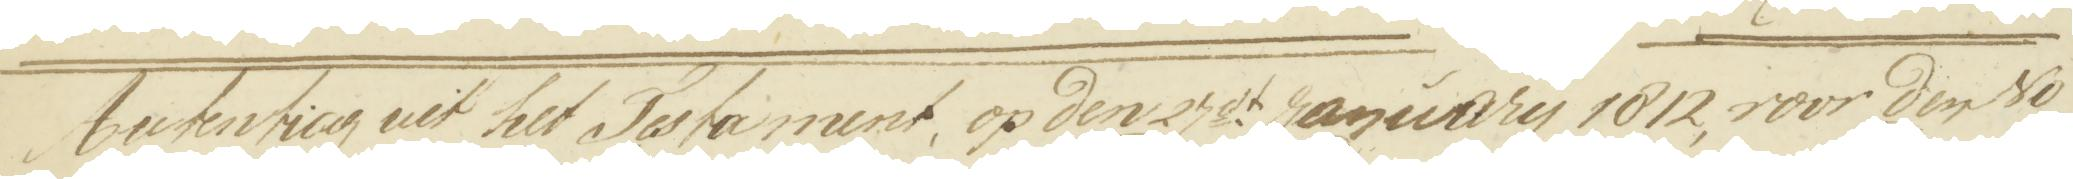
Autenticq uit het Testament, op den 27=.st January 1812 voor den No
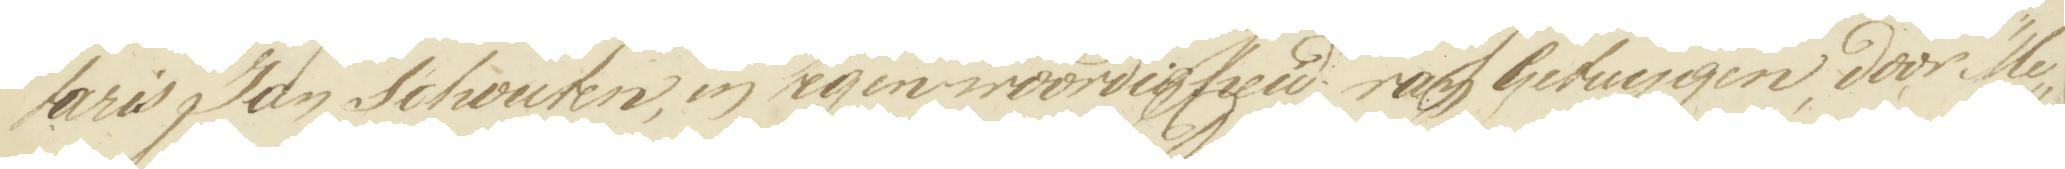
taris Ian Schouten, in tegenwoordigheid van Getuijgen, door Me„
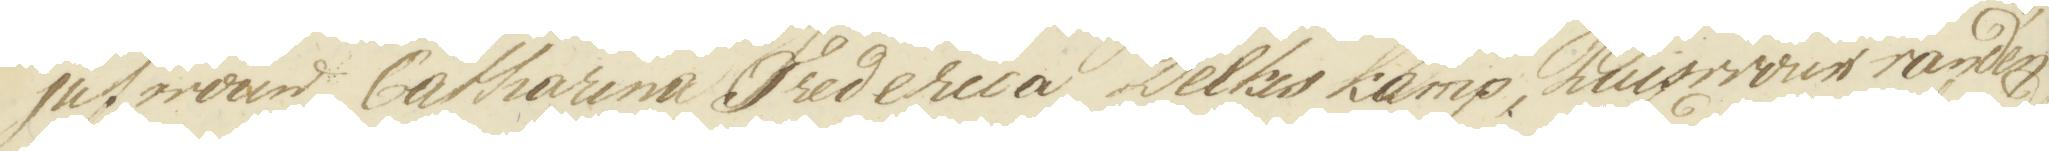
jufvrouw Catharina Frederica Delkeskamp, Huisvrouw van den
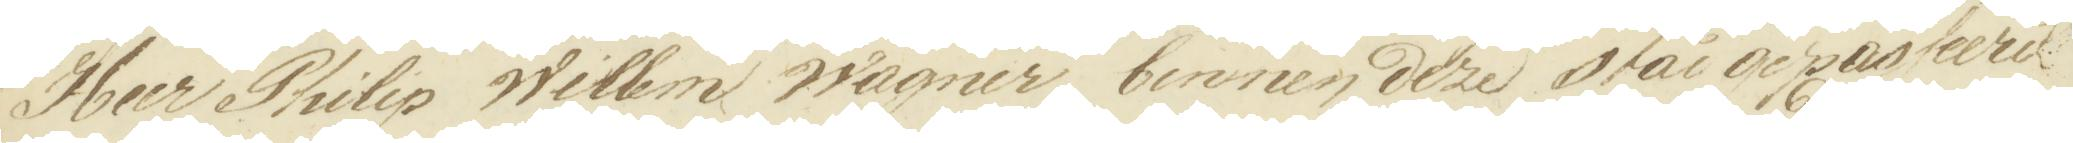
Heer Philip Willem Wagner binnen deze stad gepasseerd.
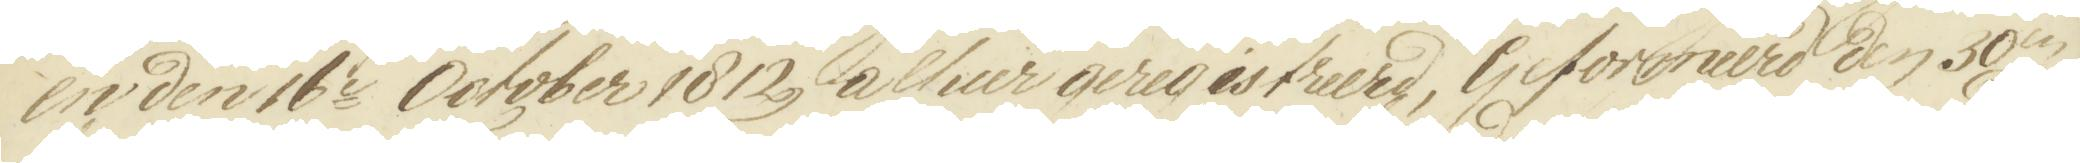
en den 16=e October 1812 alhier geregistreerd, Geformeerd den 30=en
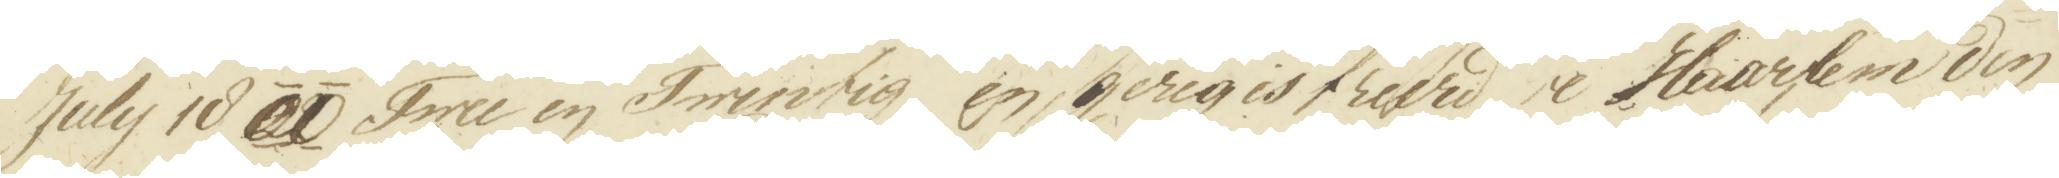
July 1822 Twee en Twintig, en, geregistreerd te Haarlem den
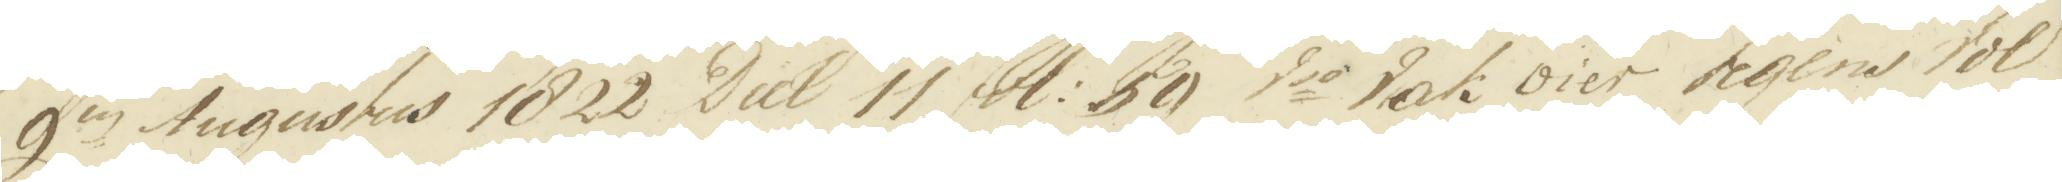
9=en Augustus 1822 Deel 11 fol: 59 V=so Vak vier tegens vol
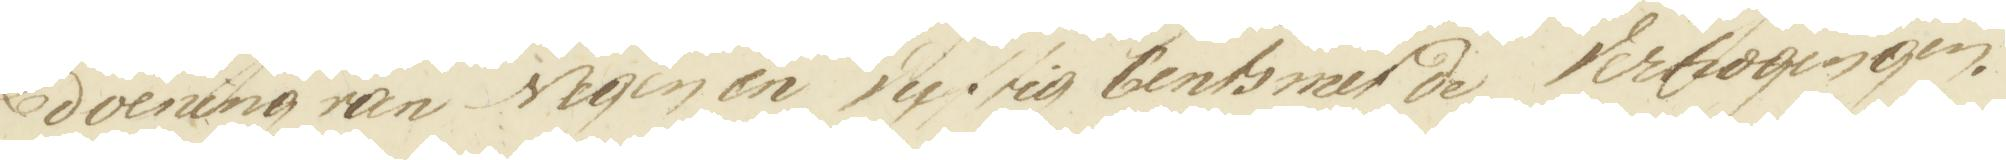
doening van Negen en vyftig Cents met de Verhogingen.
